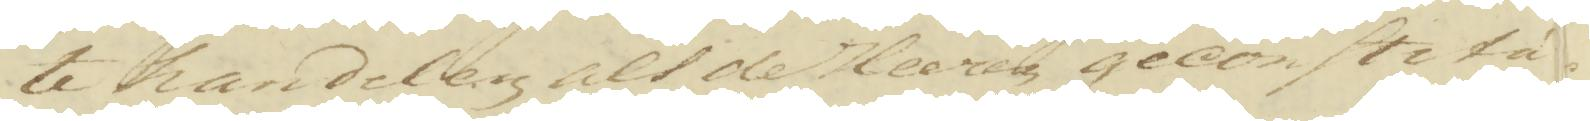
te handelen als de Heeren geconstitu
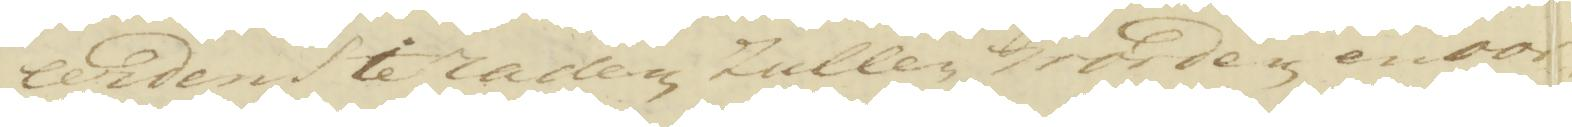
eerdens te raden zullen worden en oor
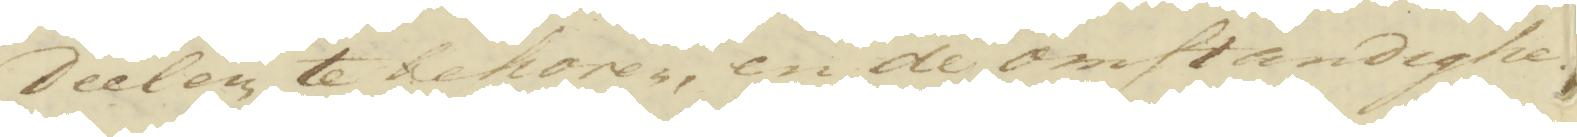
deelen te behoren, en de omstandighe
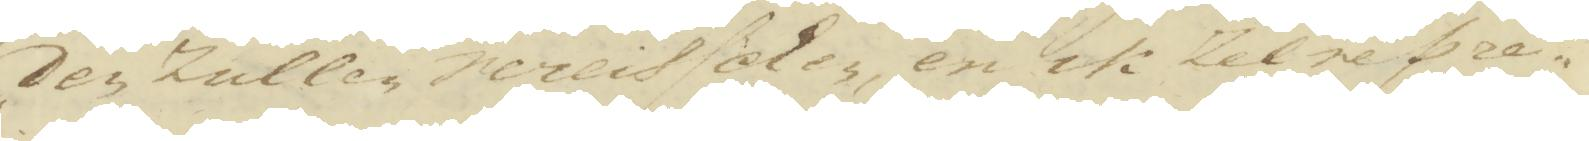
„den zullen vereisschen, en ik zelve pre„
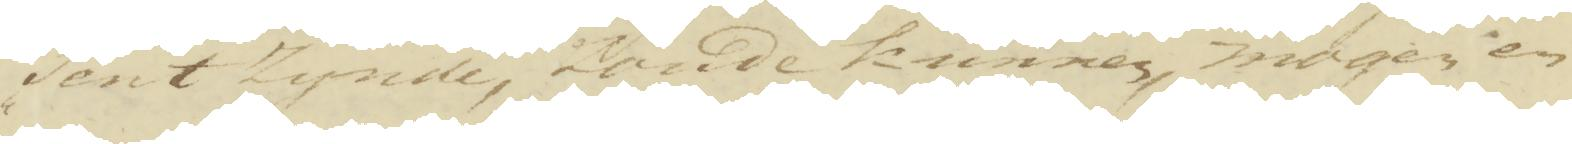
„sent zynde, zoude kunnen, mogen en
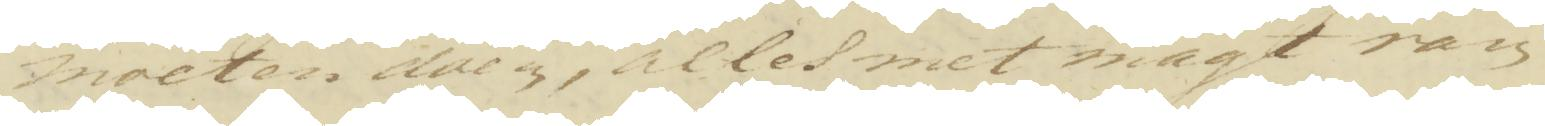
moeten doen, alles met magt van
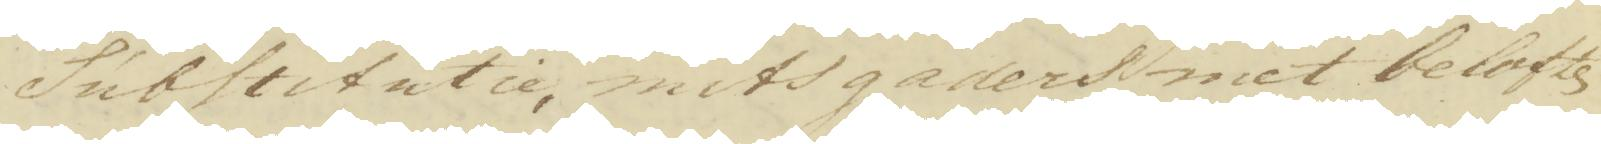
substitutie, mitsgaders met beloften
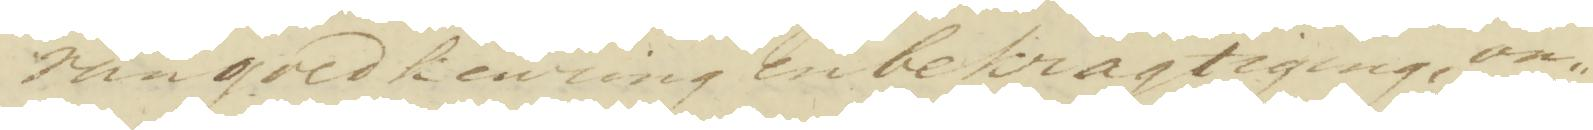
van goedkeuring en bekragtiging, on„
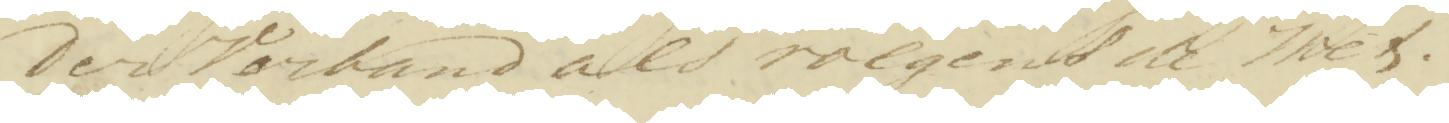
der verband als volgens de wet.
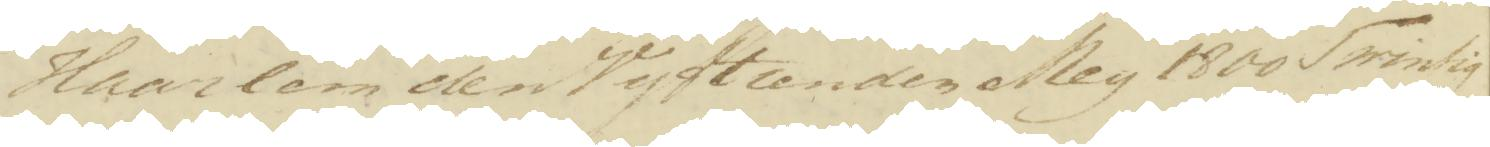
Haarlem den Vyftienden Mey 1800 Twintig
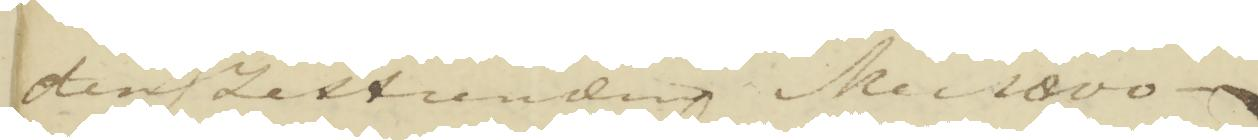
den zestienden Mei 1800
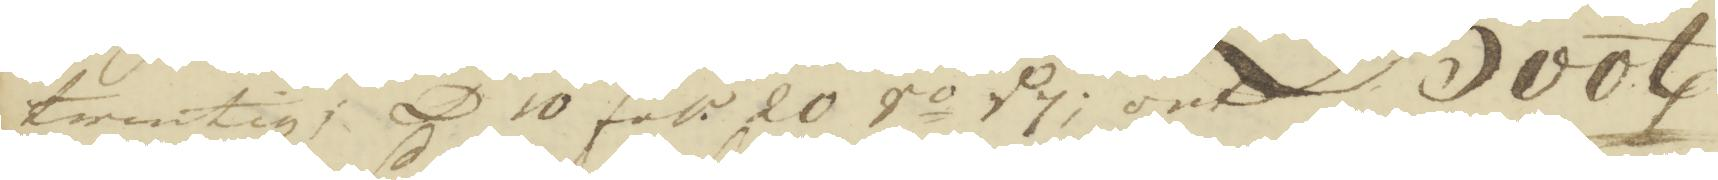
twintig; D 10 fol.o 20 v=o Cy 7; ont Boot
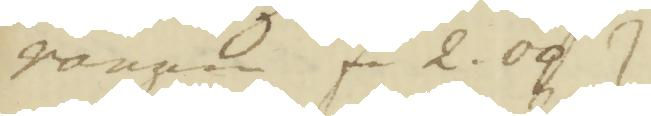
vangen ƒ 2. 00
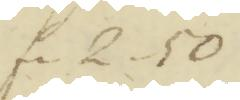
ƒ 2. 50
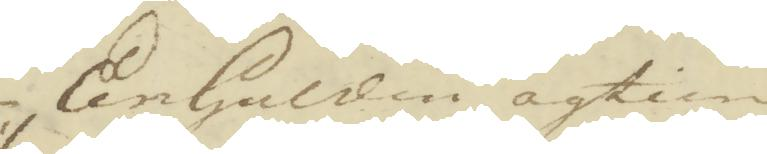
Een Gulden agtieneneenhal
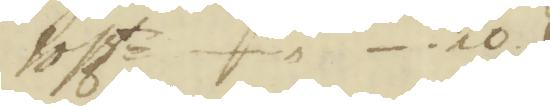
10 /c=t — „ — . 20
